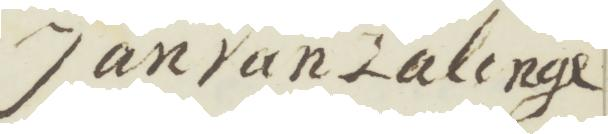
Jan Van Zalinge
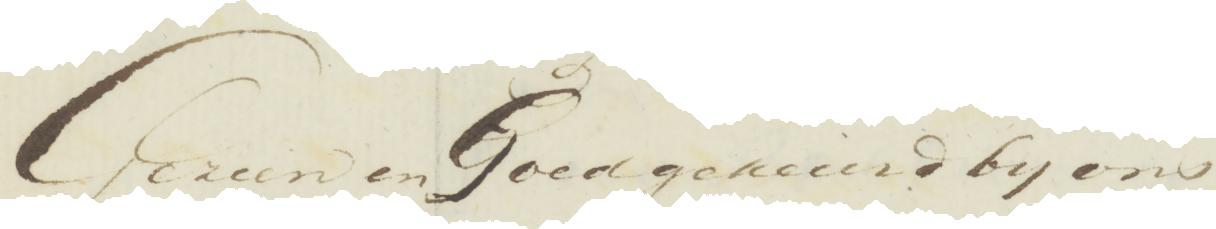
Gezien en Goedgekeurd by ons
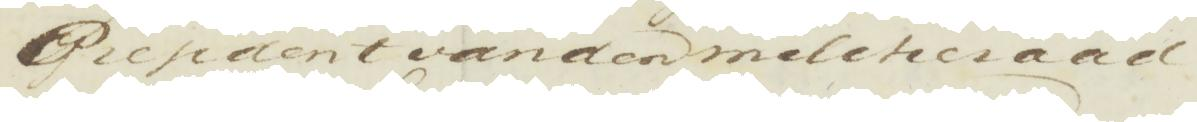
President van den militieraad
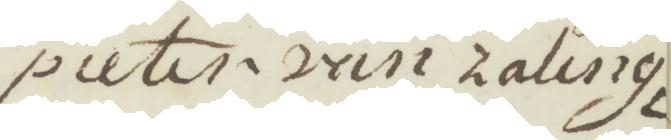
pieter van zaling
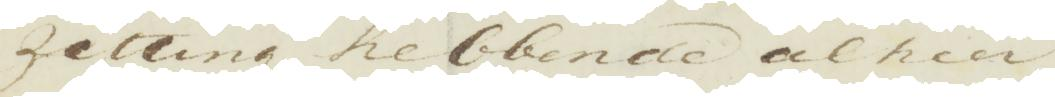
zitting hebbende alhier
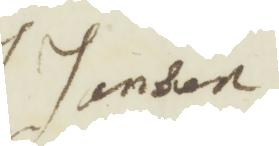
J Jansen
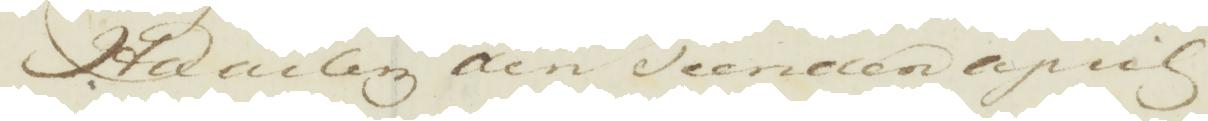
Haarlem den Tienden april
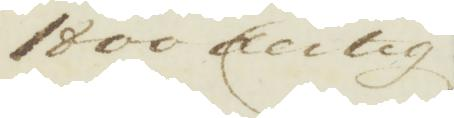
1800 dertig.
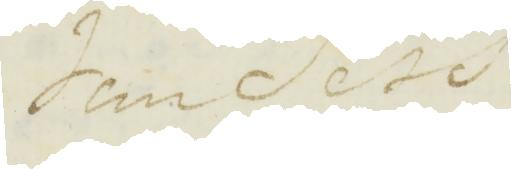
Ian Pess
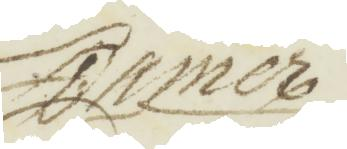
T Damer
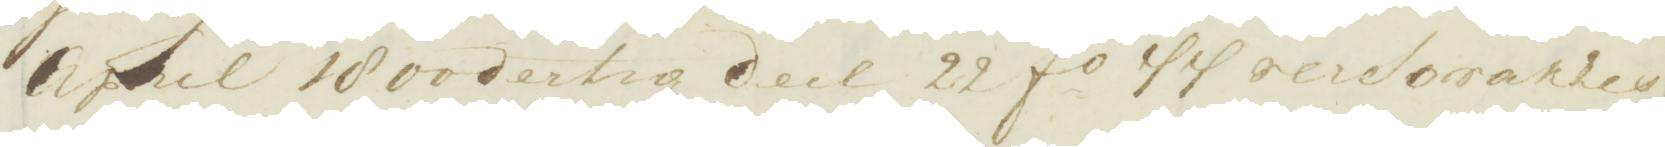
April 1800 dertig deel 22 f=o 77 verso vak zes
